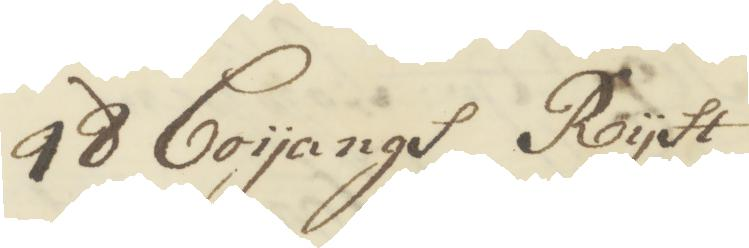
48 Coijangs Rijst
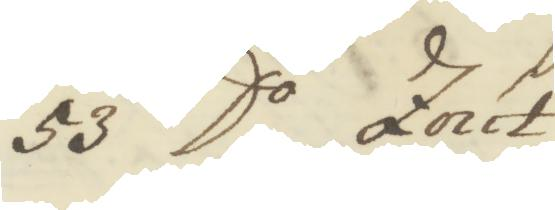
53 D„o zout
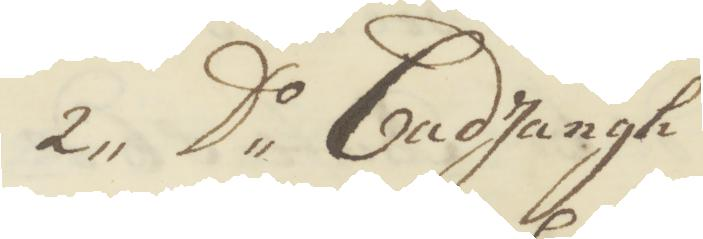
2 „ D„o Cadjangh
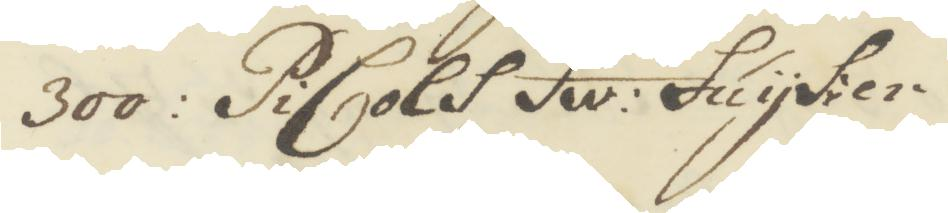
300: Picols sw: suijker
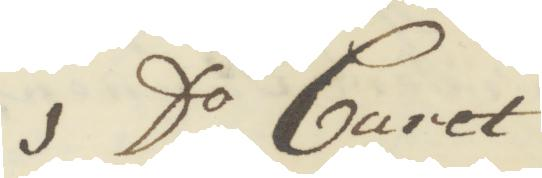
1 D„o Caret
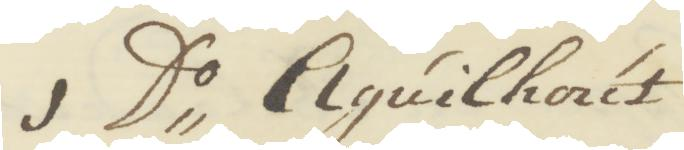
1 D„o Aguilhout
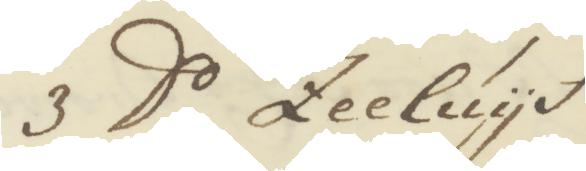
3 D„o Zeeluijs
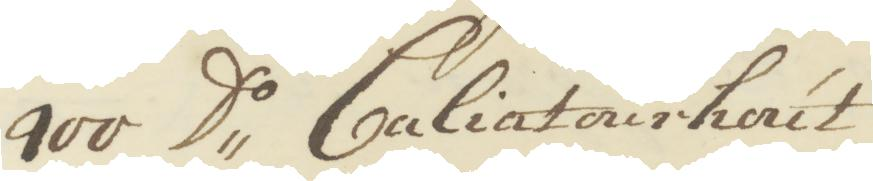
400 D„o Caliatourhout
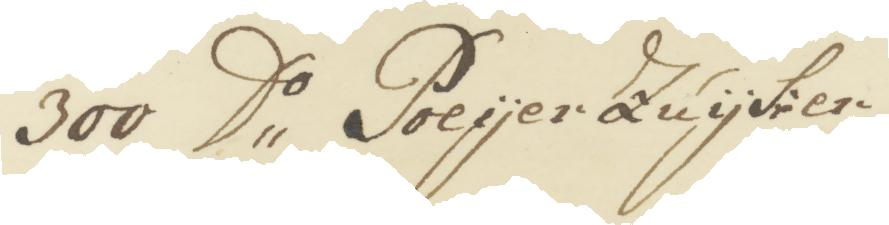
300 D„o Poeijer zuijker
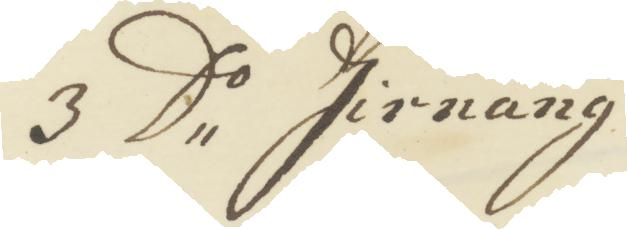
3 D„o Jirnang
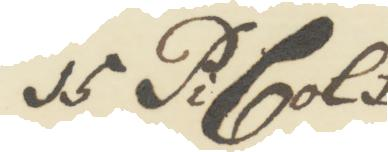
15 Picols
